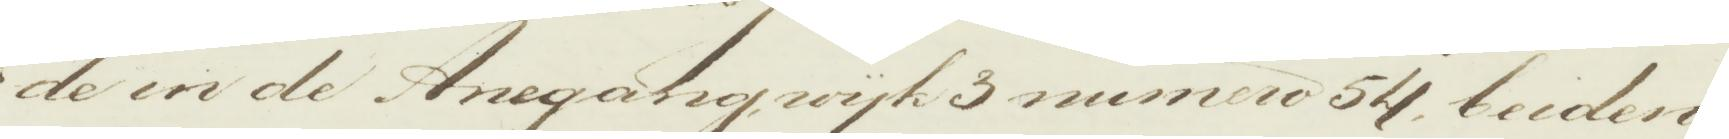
de in de Anegang wijk 3 numero 54, beiden
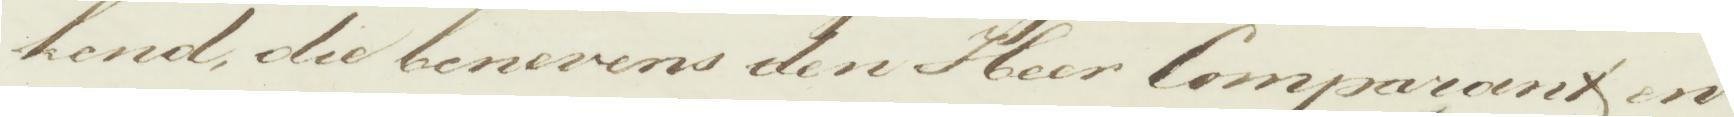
kend, die benevens den Heer Comparant en
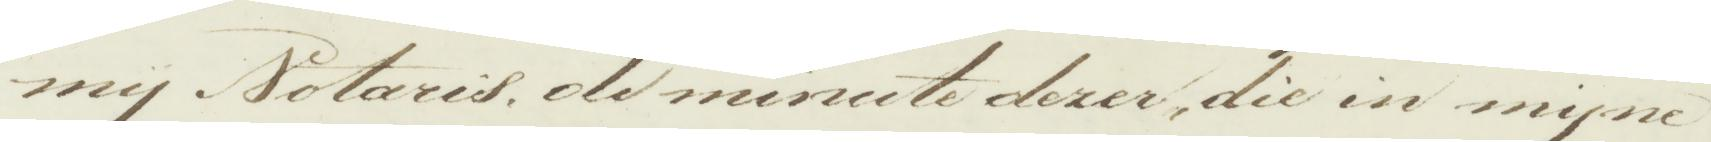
mij Notaris, de minute dezer, die in mijne
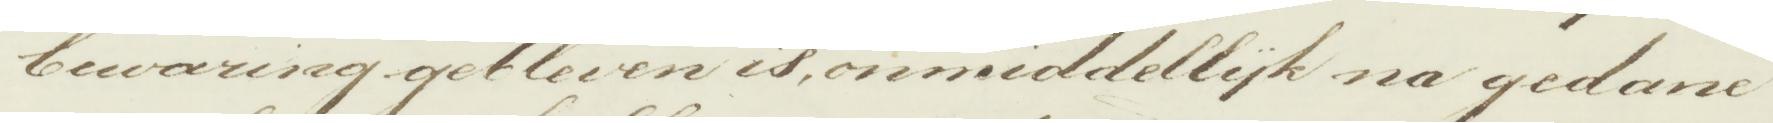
bewaring gebleven is, onmiddellijk na gedane
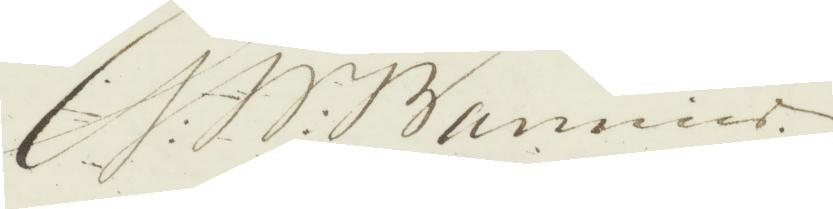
G: W: Bannier.
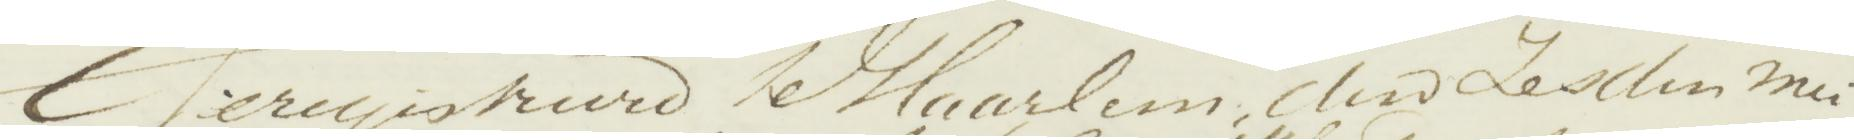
Geregistreerd te Haarlem, den Zesden mei
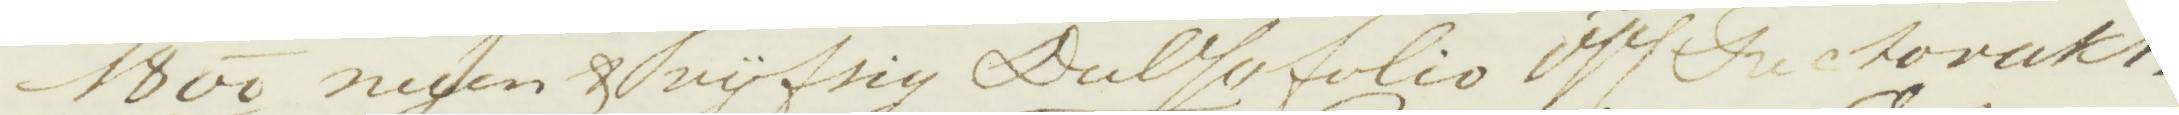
1800 negen & vijftig Deel 70 folio 177 Recto vak 1,
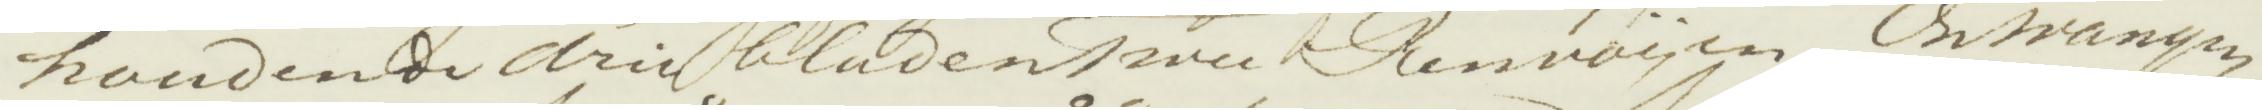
houdende drie bladen twee Renvoijen. Ontvangen
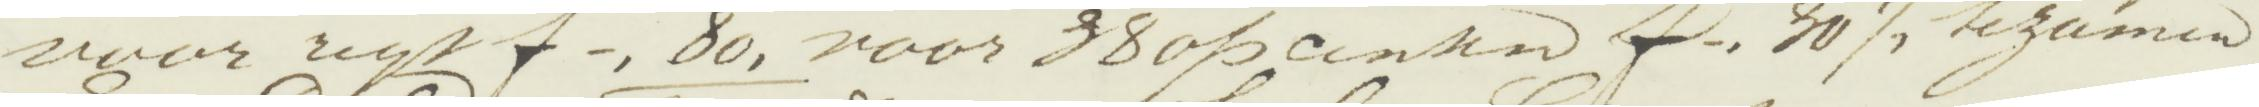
voor regt ƒ-, 80, voor 38 op centen ƒ-, 30½ tezamen
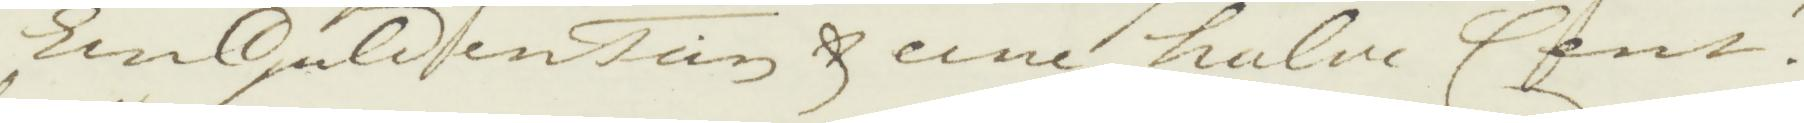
Een Gulden Tien & eene halve Cent.
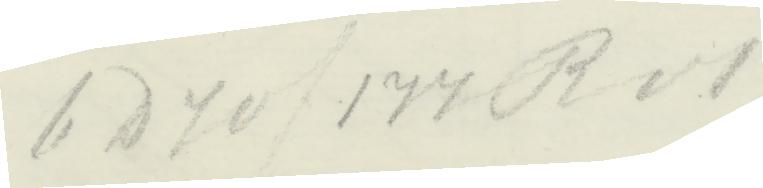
6D70f177Rv1
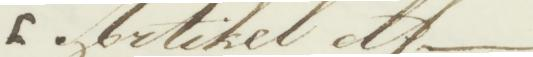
¶ Artikel elf
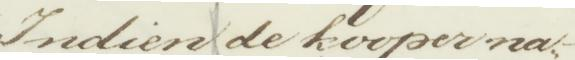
Indien] de kooper na„
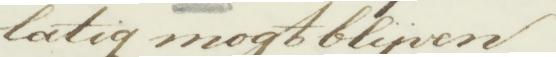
latig mogt blijven
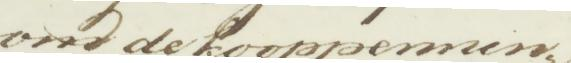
om de kooppennin„
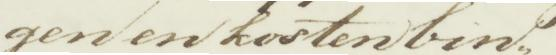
gen en kosten bin„
